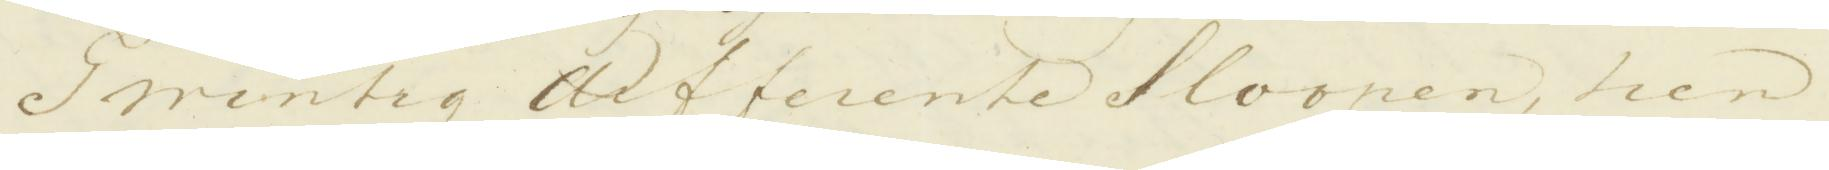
Twintig differente sloopen, tien
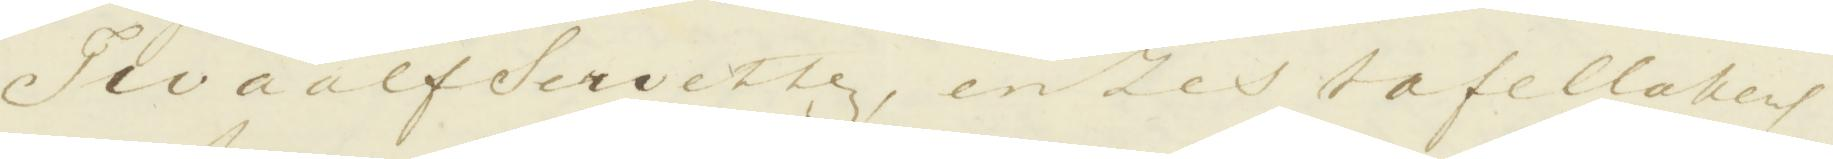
Twaalf Servetten, en zes tafellakens
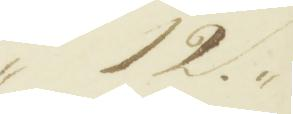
„ 12.„
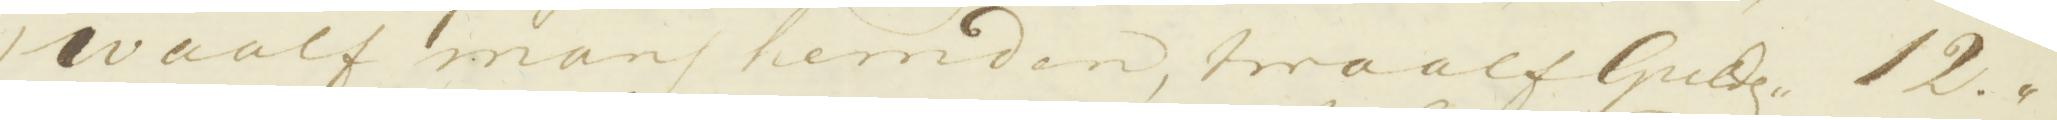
Twaalf mans hemden twaalf Gulden 12. „
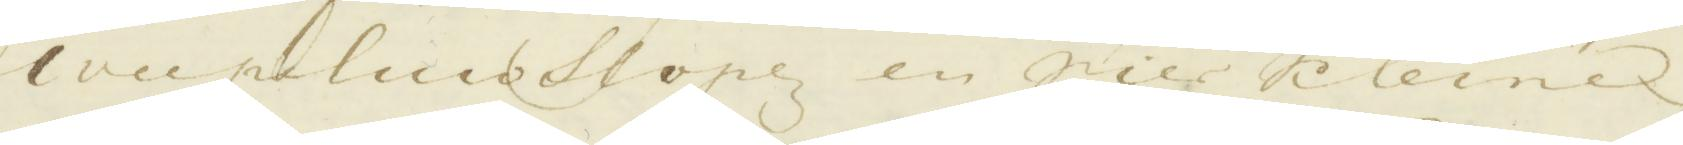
Twee peluwslopen en vier kleine
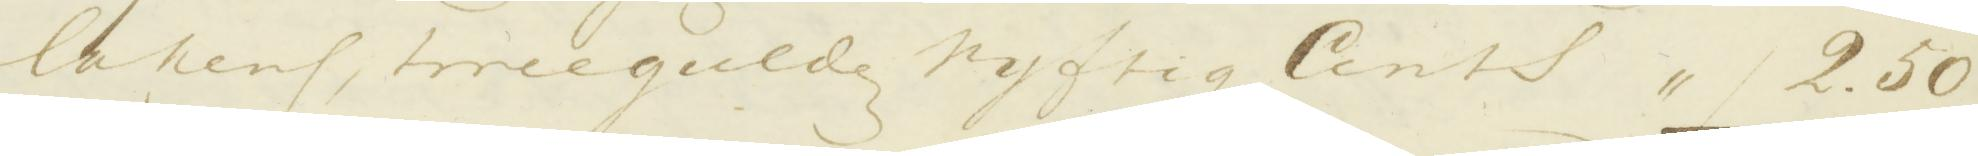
lakens, twee gulden vyftig Cents „ ƒ2.50
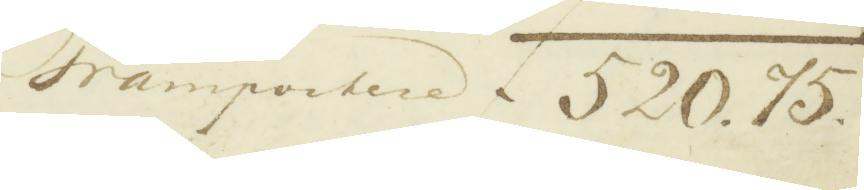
Transportere ƒ 520:75.
